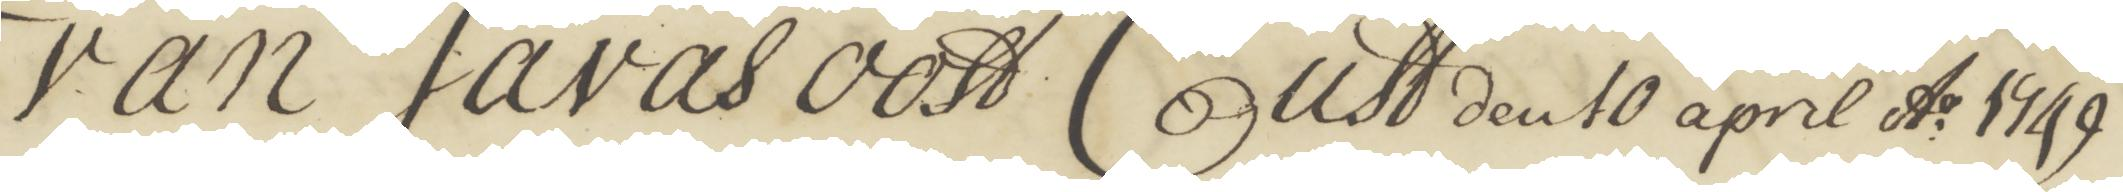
Van Javas oost Cust den 10 april A:o 1749
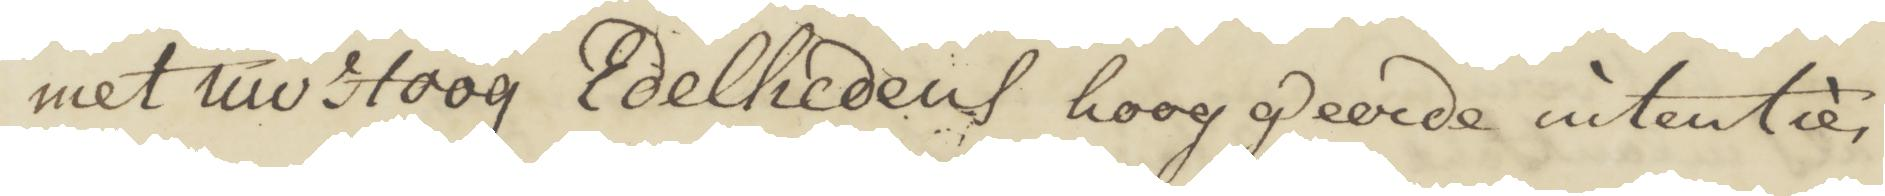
met uw Hoog Edelhedens hoog g'eerde intentie
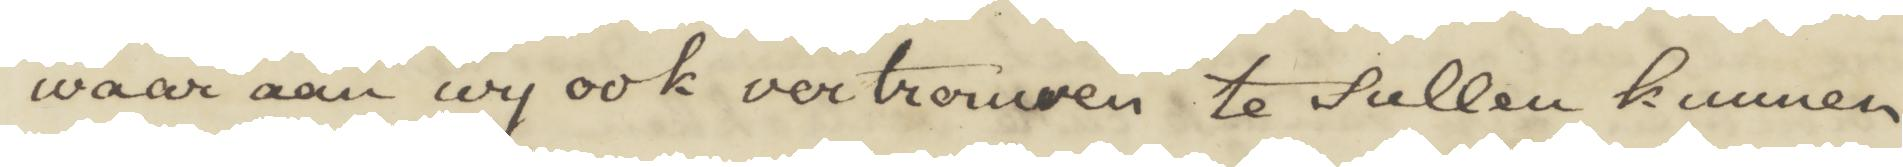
waar aan wy ook vertrouwen te sullen kunnen
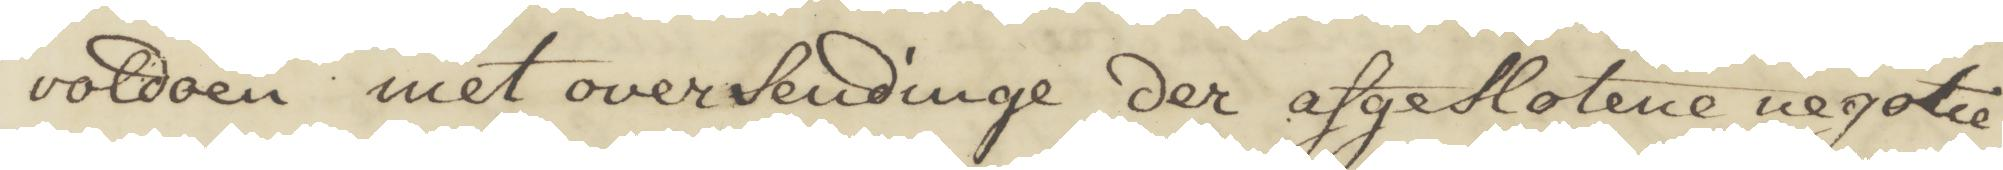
voldoen met oversendinge der afgeslotene negotie
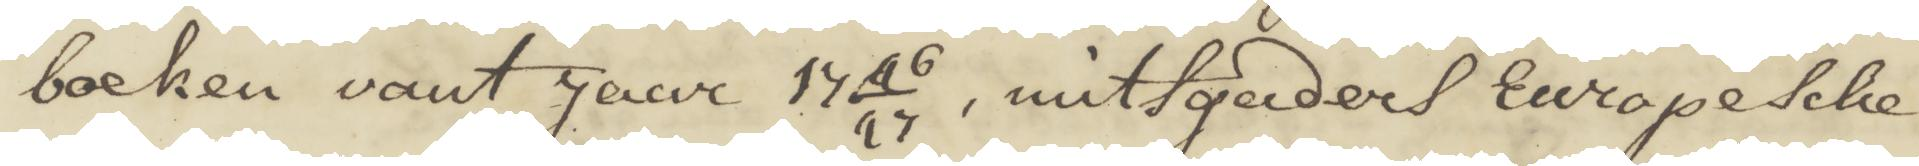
boeken vant Jaar 1746/47, mitsgaders Europesche
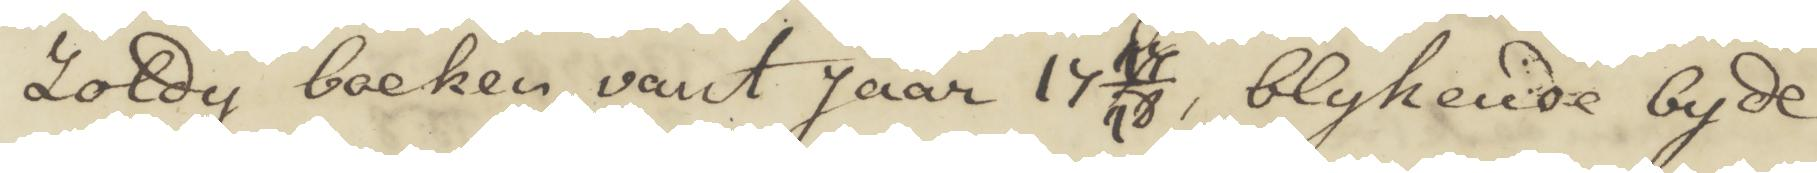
zoldy boeken vant Jaar 1747/48, blykende by de
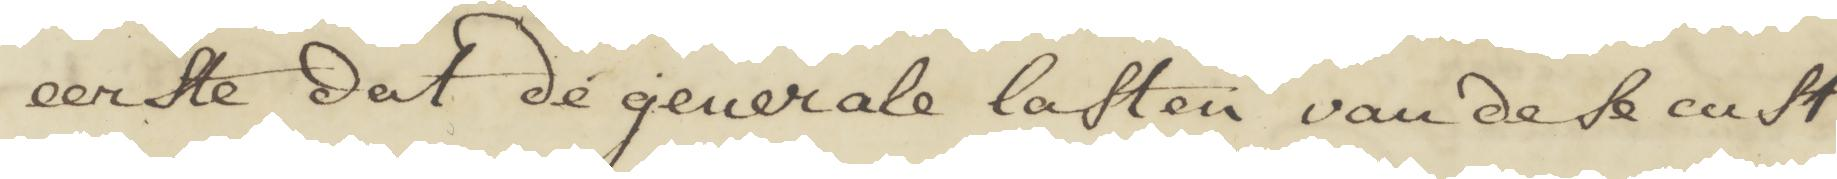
eerste dat de generale lasten van dese cust
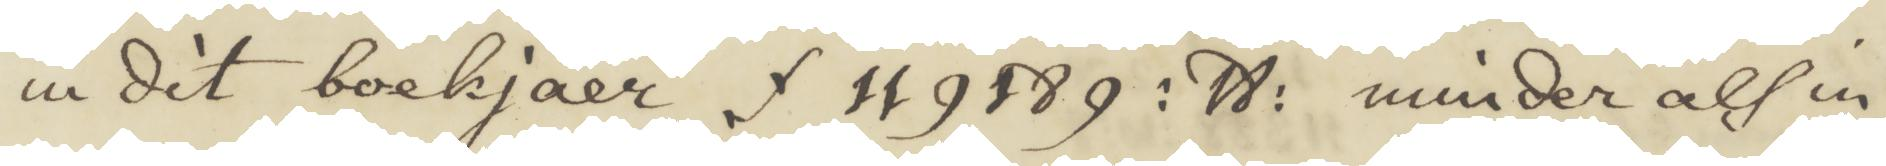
in dit boekjaer ƒ 119189: 18: minder als in
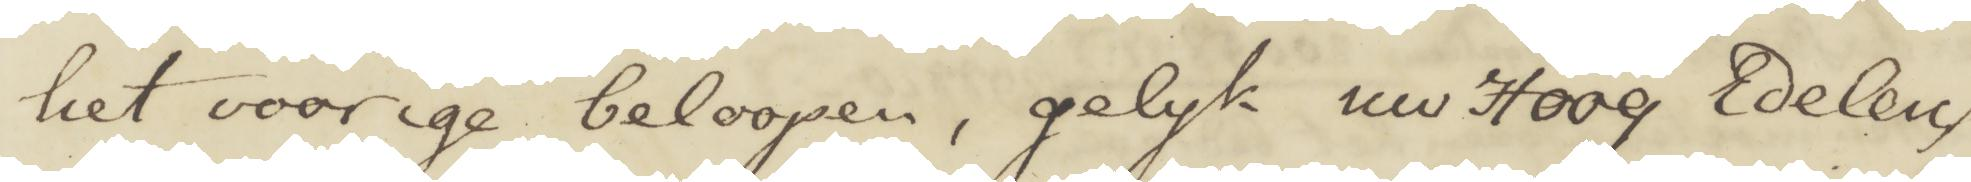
het voorige beloopen, gelyk uw Hoog Edelen
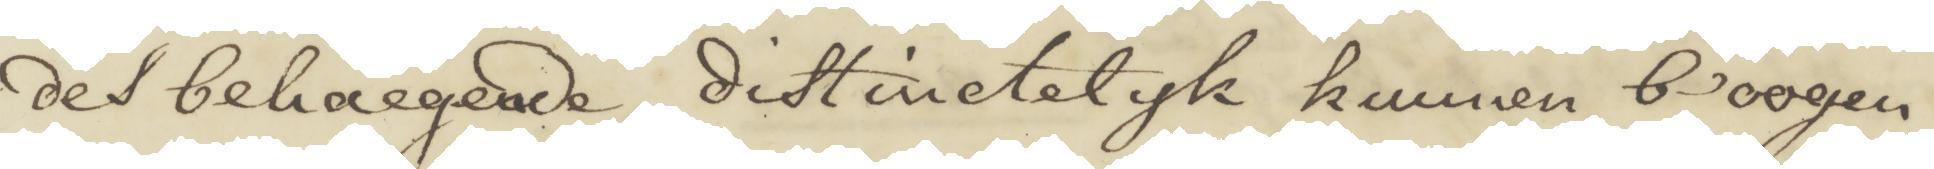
des behaegende distinctelyk kunnen b'oogen
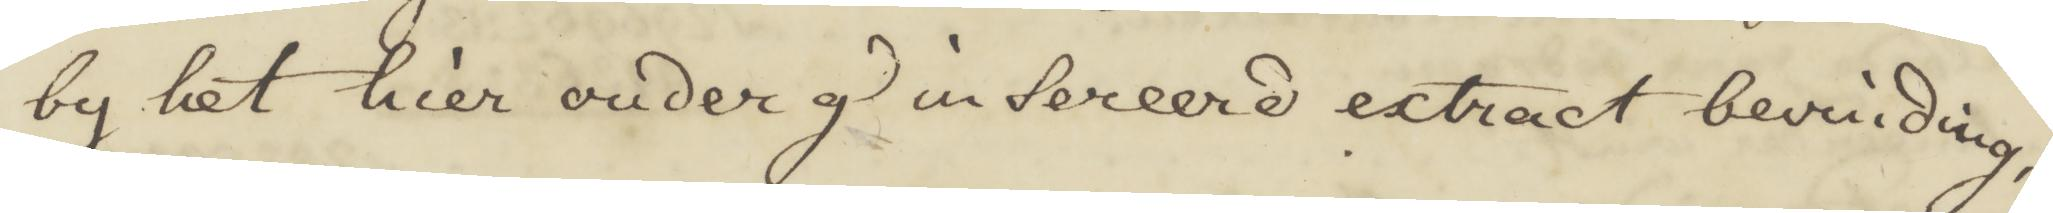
by het hier onder g’insereerd extract bevinding
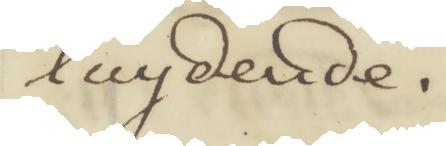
luydende.
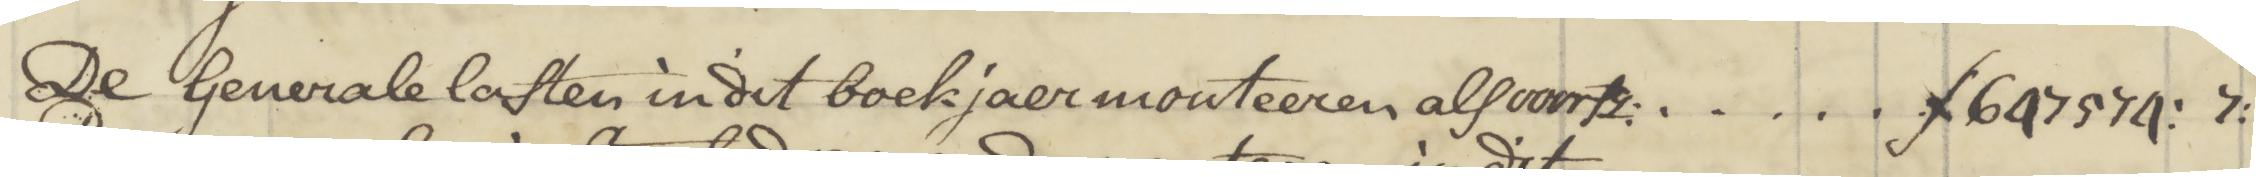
De Generale lasten in dit boekjaer monteeren als voorsz: . . . . . . ƒ647574: 7:8
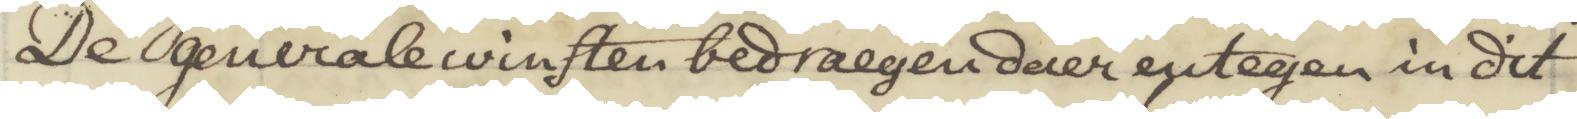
De generale winsten bedraegen daer entegen in dit
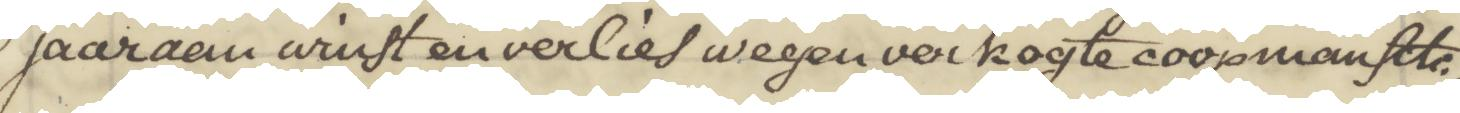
jaar aan winst en verlies wegen verkogte coopmans etc.
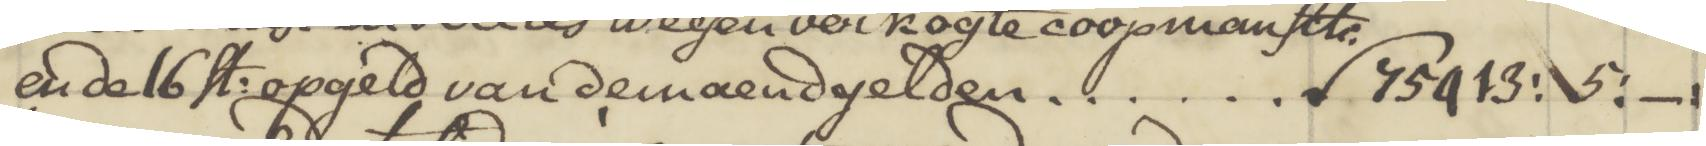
en de 16 st: opgeld van de maendgelden . . . . . . ƒ75413: 5: —:
